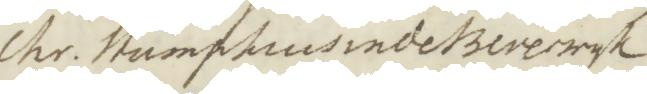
Chr. Stumphius in de Beverwyk
